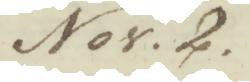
Nov. 2.
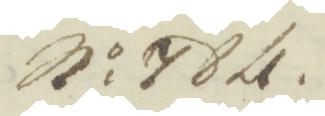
N:o 784.
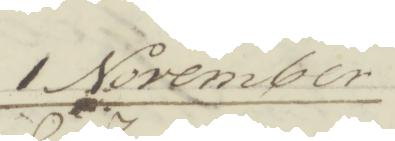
1 November
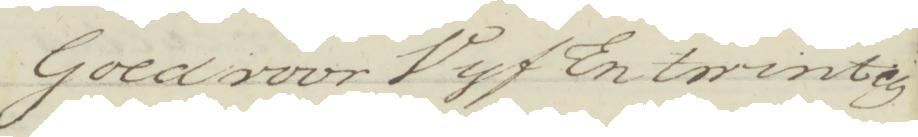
Goed voor Vyf En twintig
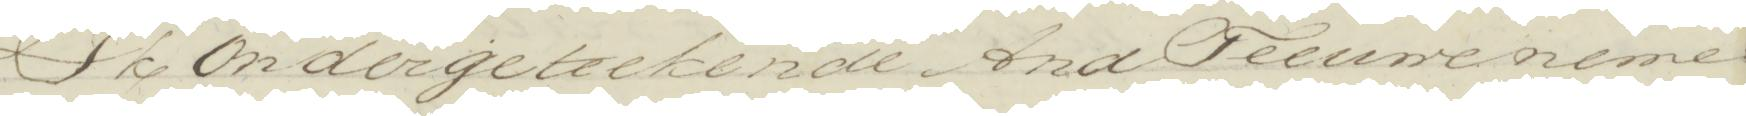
Ik Ondergeteekende And Teeuwe neme
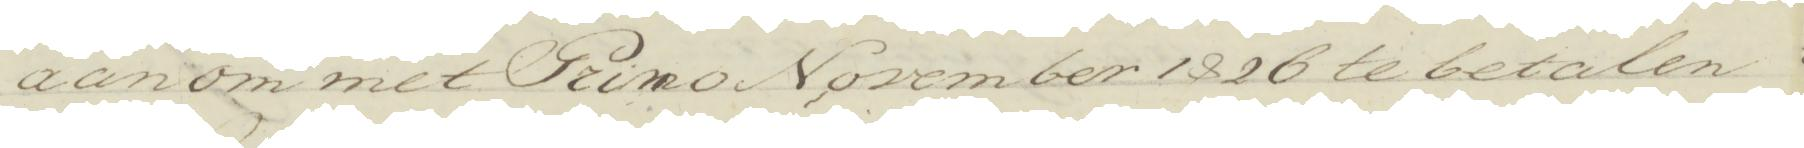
aan om met Primo November 1826 te betalen
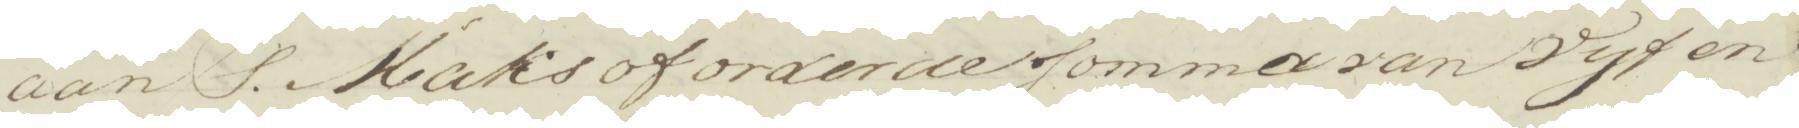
aan S. Maks of order de somma van Vyf en
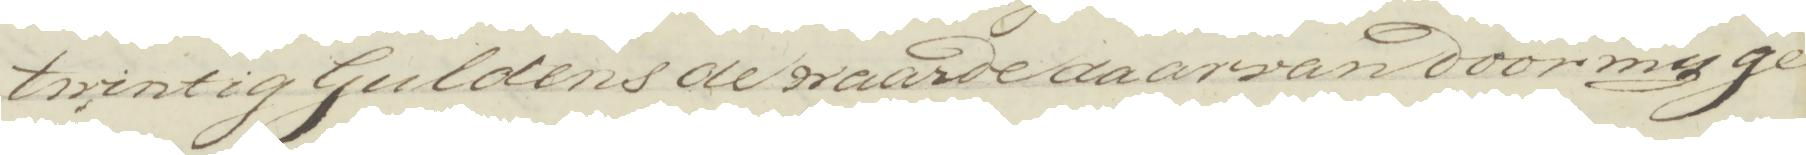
twintig Guldens de waarde daarvan door my ge
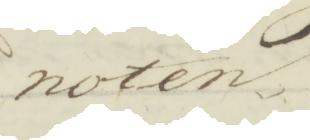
noten
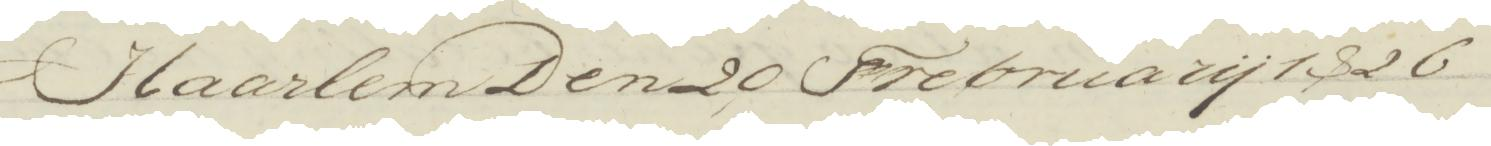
Haarlem Den 20 Frebruary 1826
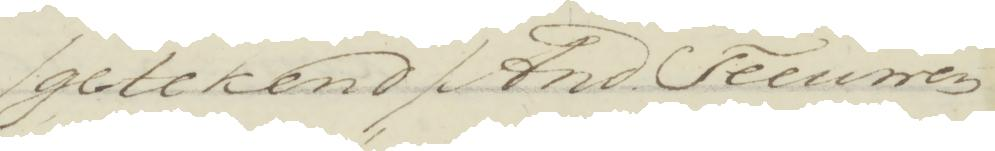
/getekend/ And Teeuwen
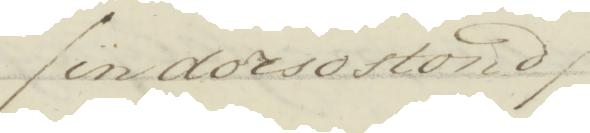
/in dorso stond/
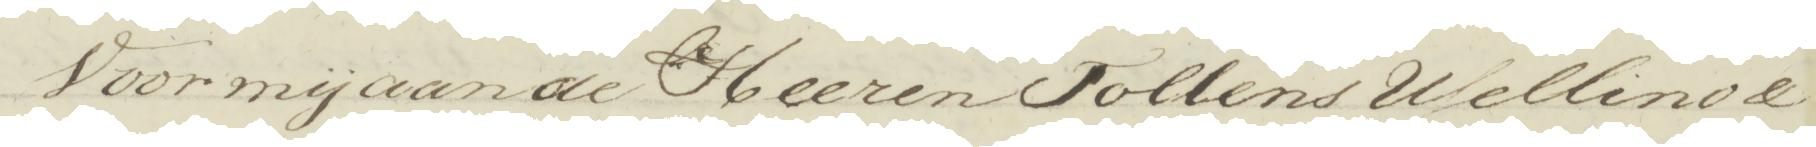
Voor mij aan de Heeren Tollens Usellino &
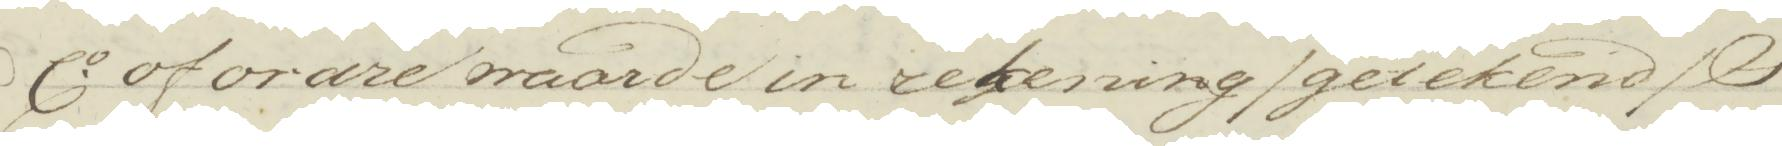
C.o of ordre waarde in rekening /getekend/ S
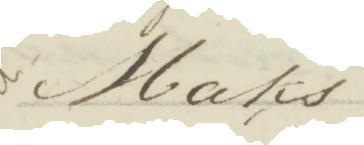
Maks
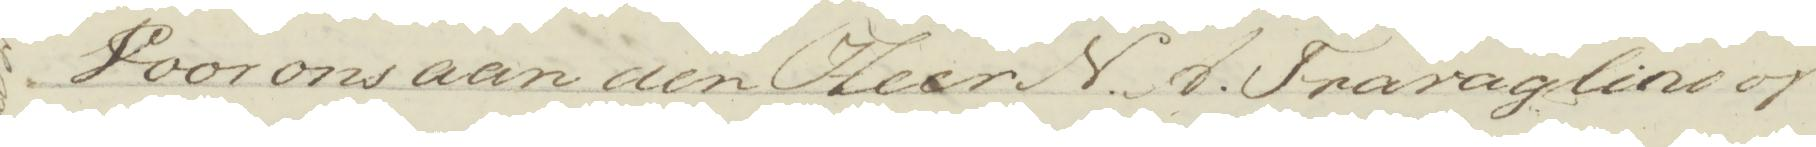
Voor ons aan den Heer N. A. Fravaglino of
